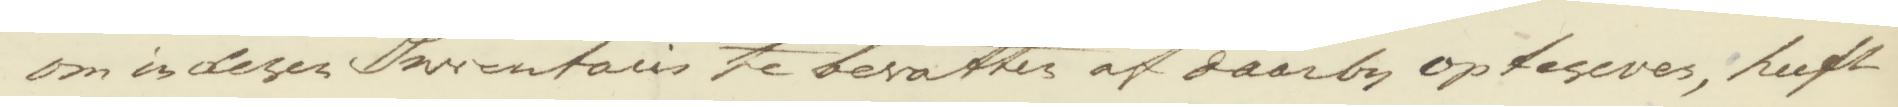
om in dezen Inventaris te bevatten of daarby op tegeven, heeft
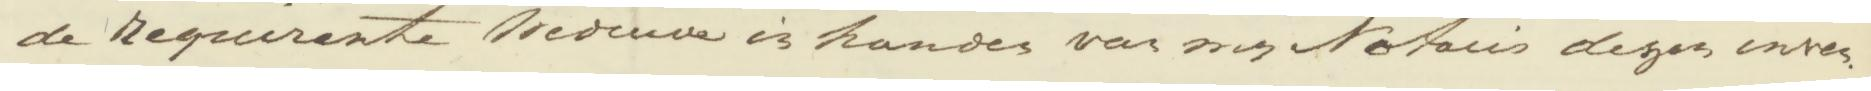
de Requirante weduwe in handen van my Notaris dezen inven
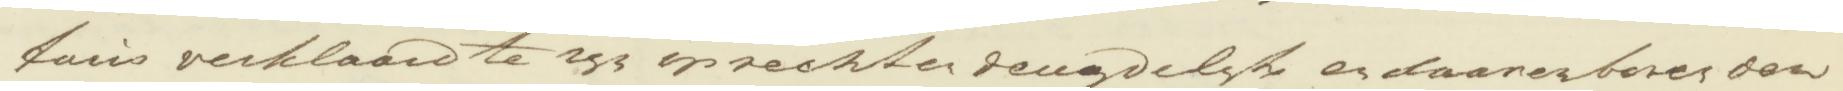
taris verklaard te zyn oprecht en deugdelyk en daarenboven den
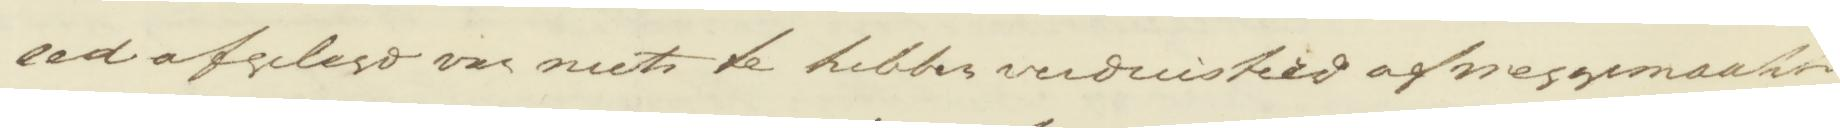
eed afgelegd van niets te hebben verduisterd of weggemaakt
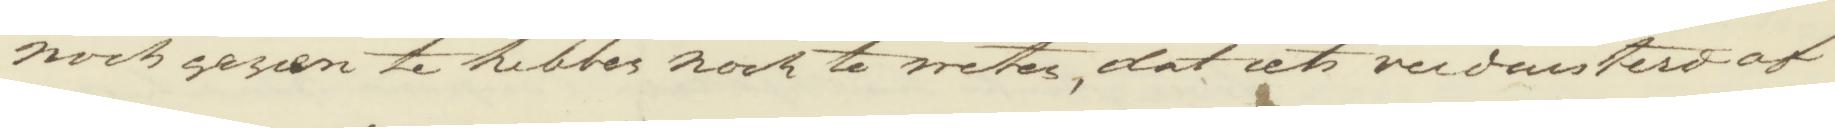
noch gezien te hebben noch te weten, dat iets verduisterd of
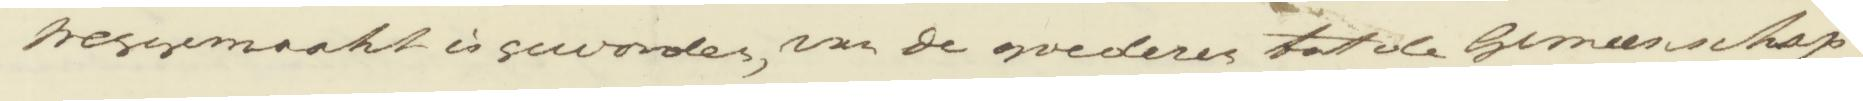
weggemaakt is geworden, van de goederen tot de Gemeenschap
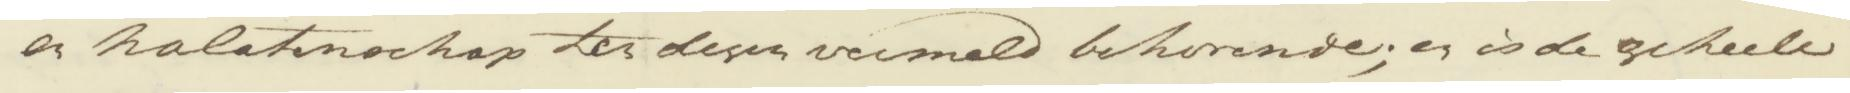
en Nalatenschap ten dezen vermeld behorende; en is de geheele
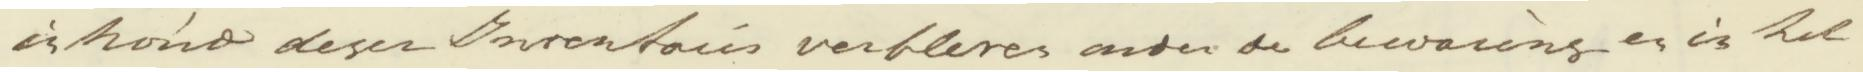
inhoud dezer Inventaris verbleven onder de bewaring en in het
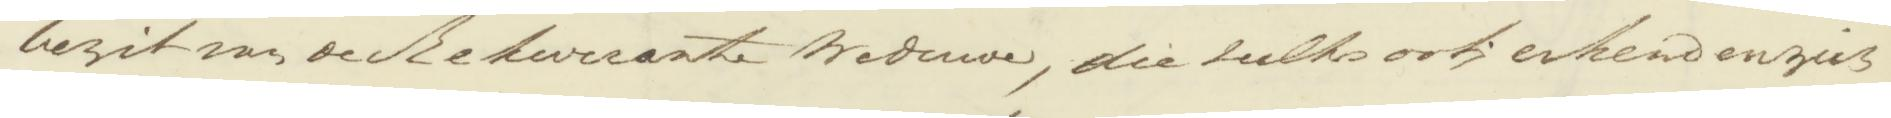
bezit van de Rekwirante Weduwe, die zulks ook erkend en zich
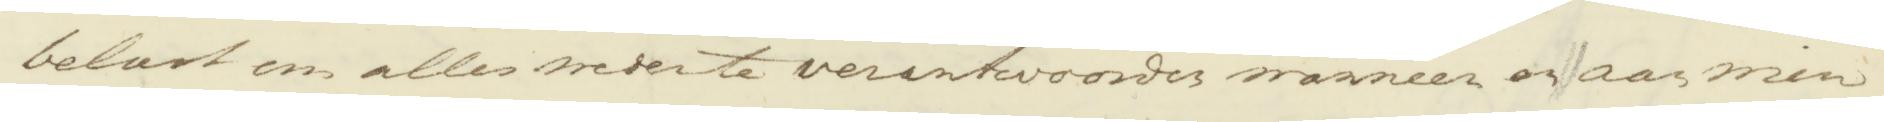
belast in alles weder te verantwoorden wanneer en aan wien
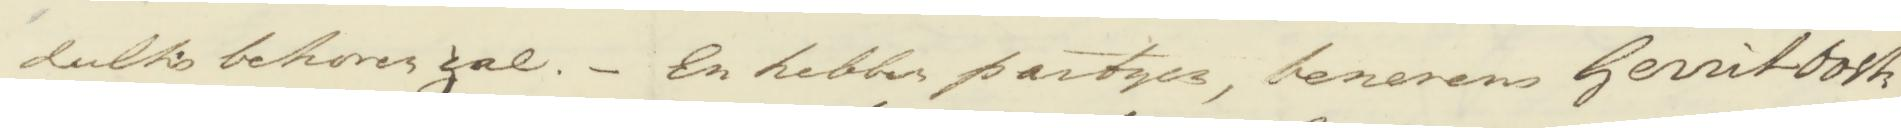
zulk behoren zal. — En hebben partyen, benevens Gerrit Oost
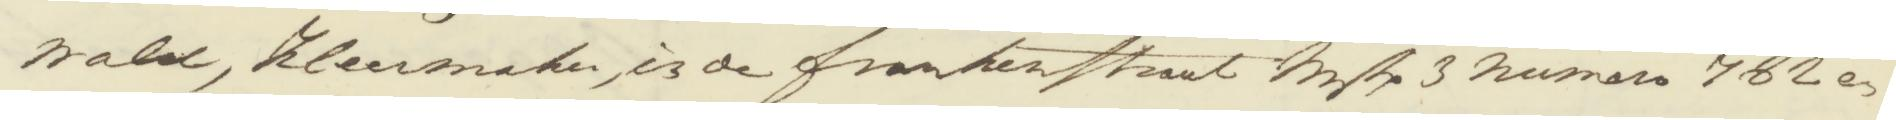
wald, kleermaker, in de frankenstraat wyk 3 numero 782 en
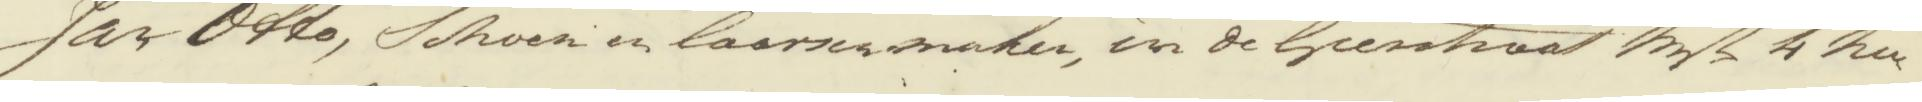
Jan Otto, schoen en laarsen maker, in de Gierstraat Wyk 4 Nu
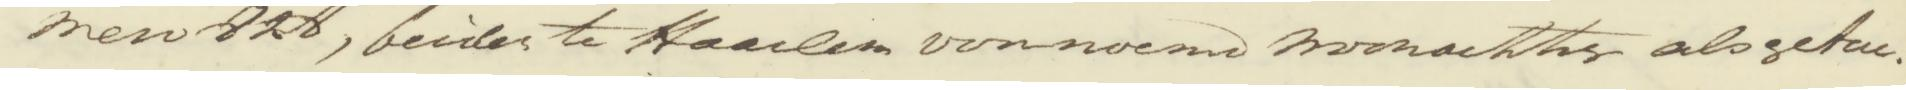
mero 728, beiden te Haarlem voornoemd woonachtig als getui„
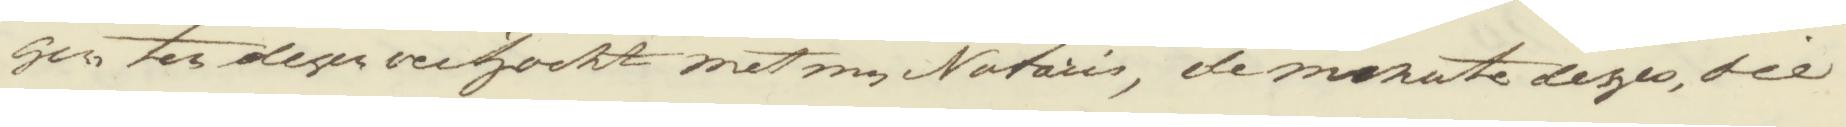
gen ten dezen verzocht met my Notaris, de minute dezes, die
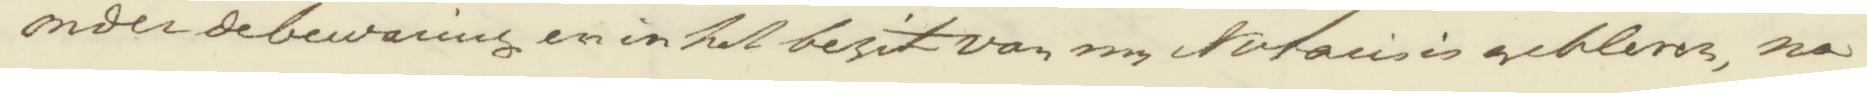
onder de bewaring en in het bezit van my Notaris is gebleven, na
